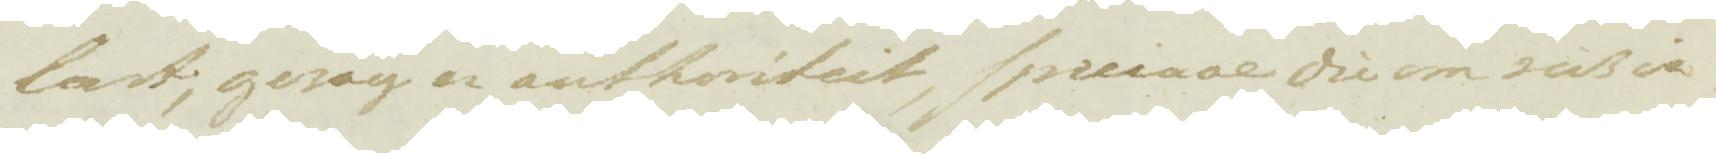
last, gezag en authoriteit, speciaal die om zich in
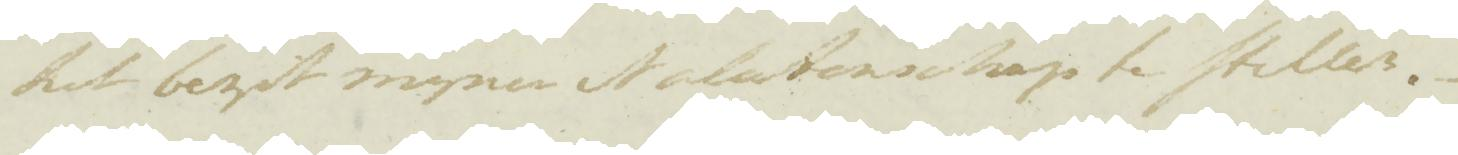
het bezit myner Nalatenschap te stellen.
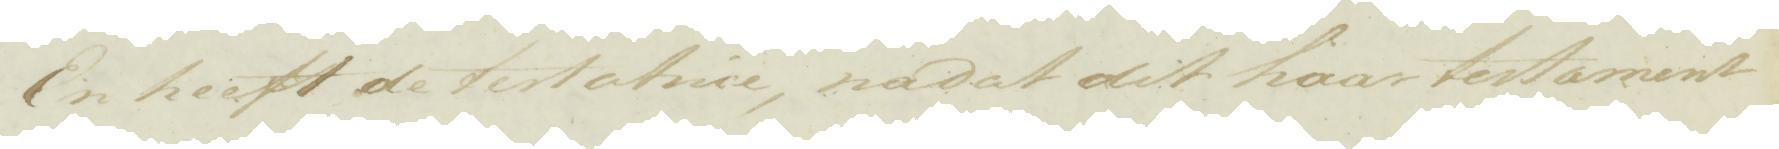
En heeft de testatrice, nadat dit haar testament
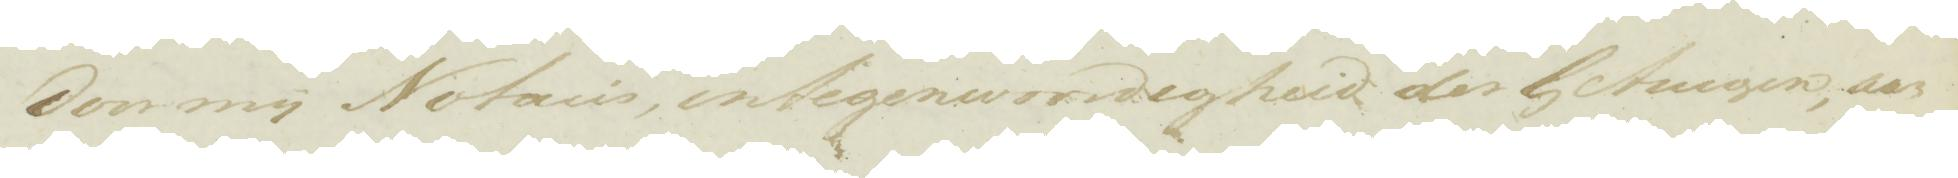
door mij Notaris, in tegenwoordigheid der Getuigen, aan
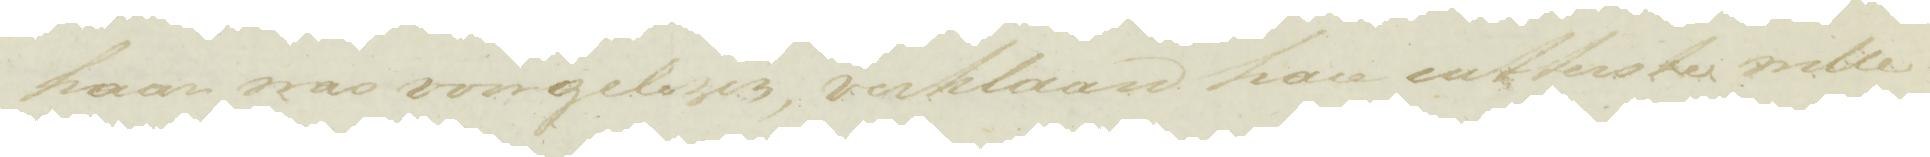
haar was voorgelezen, verklaard hare uitterste wille
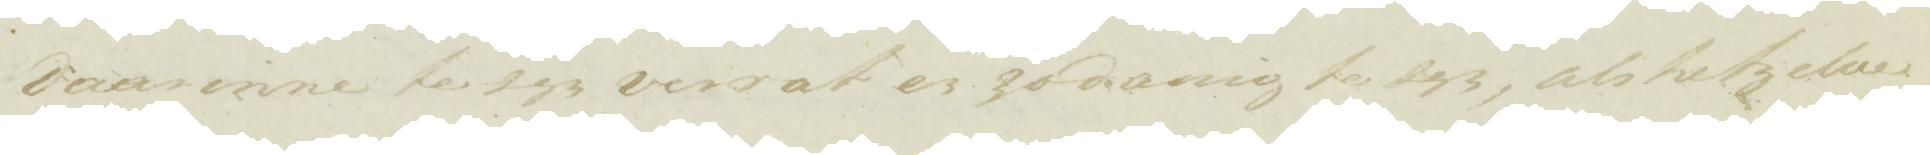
daar inne te zyn vervat en zodanig te zyn, als hetzelve
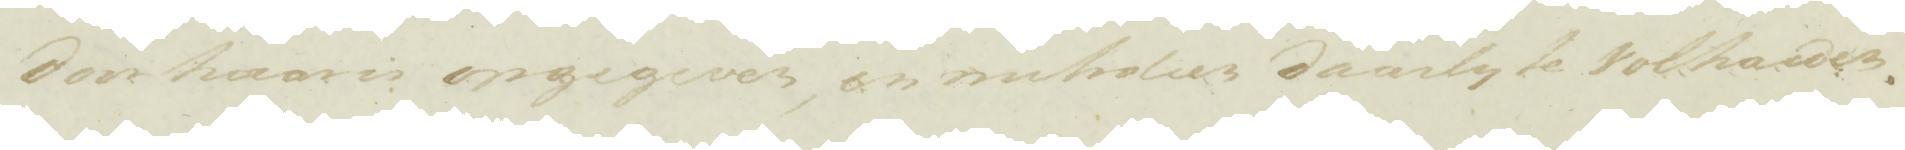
door haar is opgegeven, en mitsdien daarlyk volharden
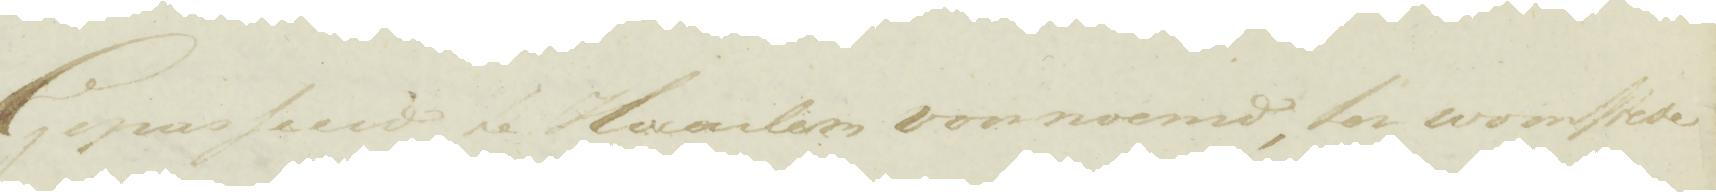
Gepasseerd te Haarlem voornoemd, ter woonstede
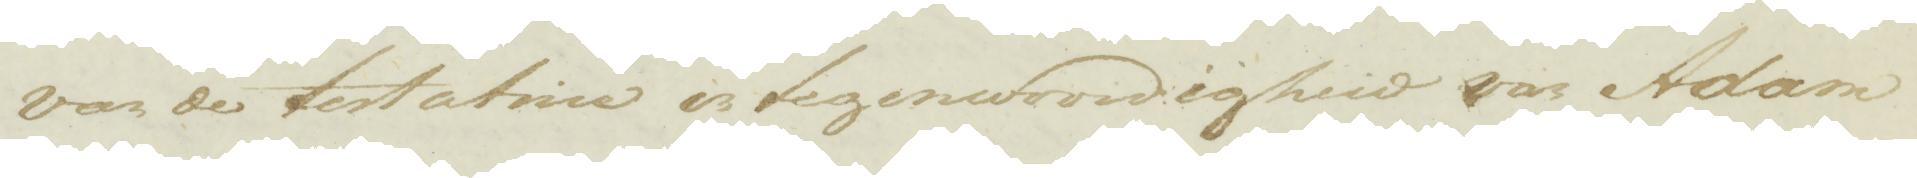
van de testatrice in tegenwoordigheid van Adam
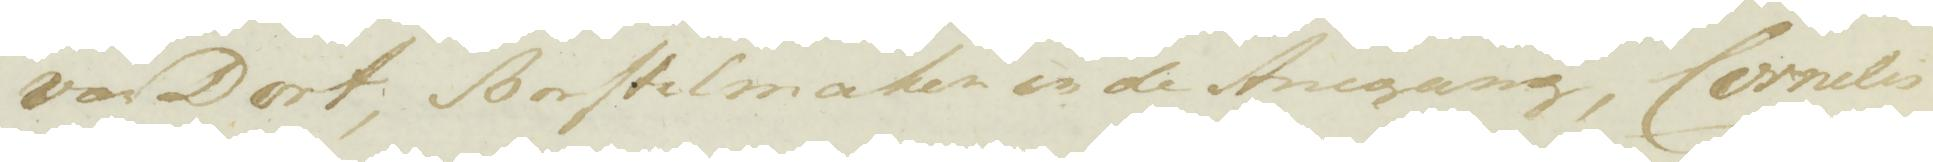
van Dort, Borstelmaker in de Anegang, Cornelis
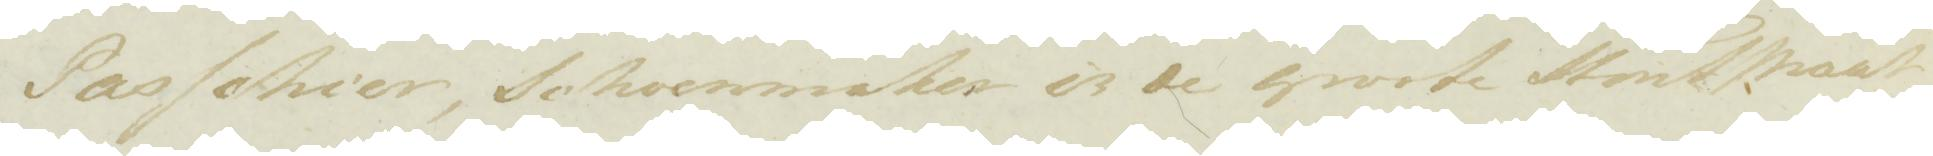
Passchier, schoenmaker is de Groote Houtstraat
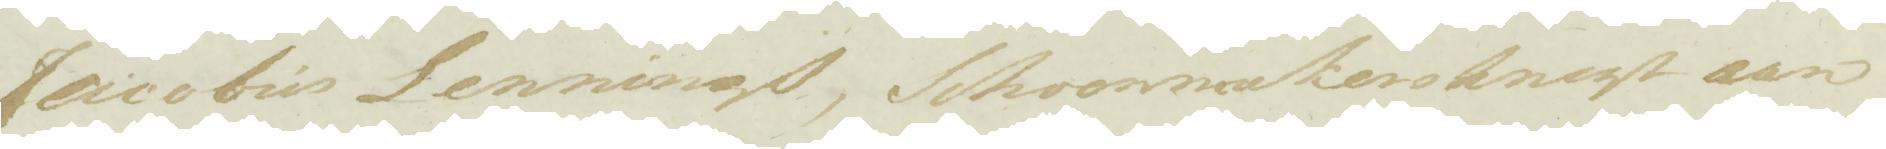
Jacobus Lennings, schoonmakersknegt aan
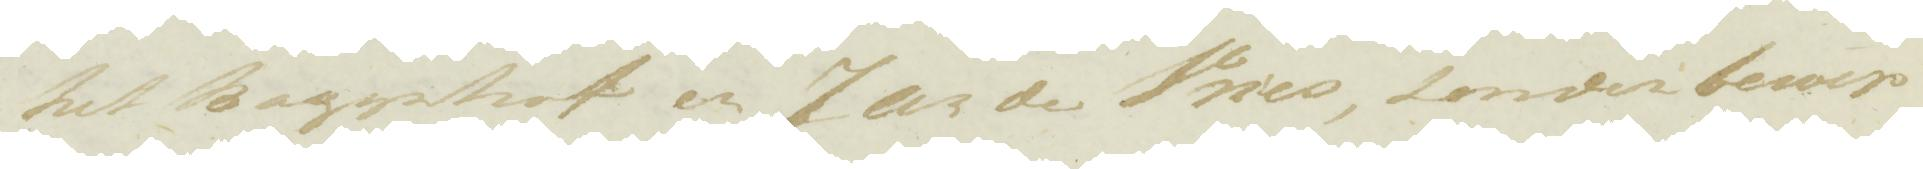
het Bagynhof en Jan de Vries, zonder beroep
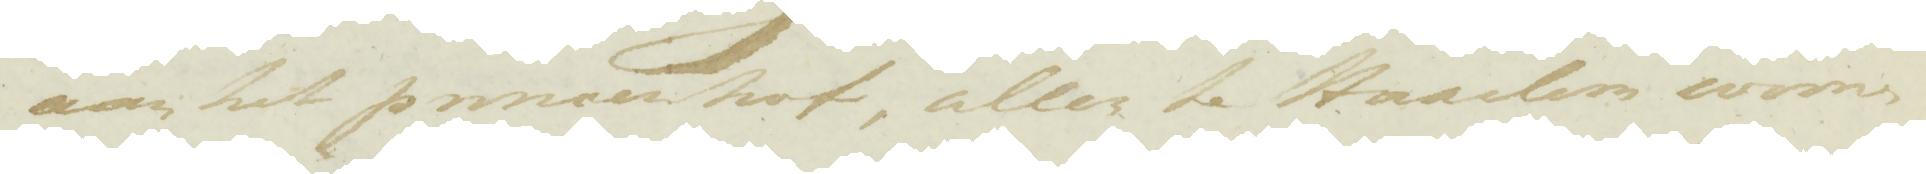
aan het princenhof, allen te Haarlem woon
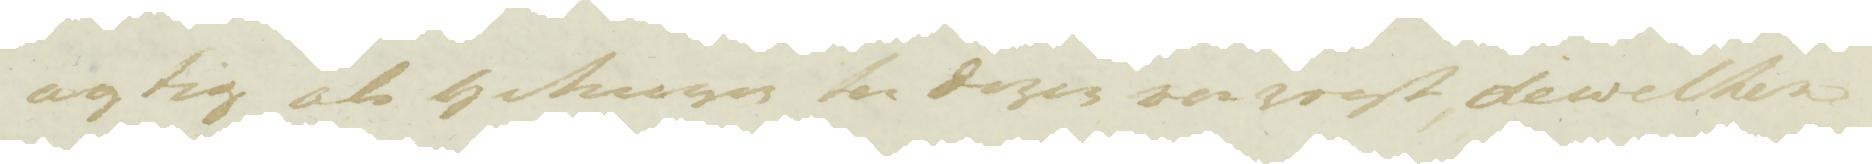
agtig als getuigen ten dezen verzogt, dewelken
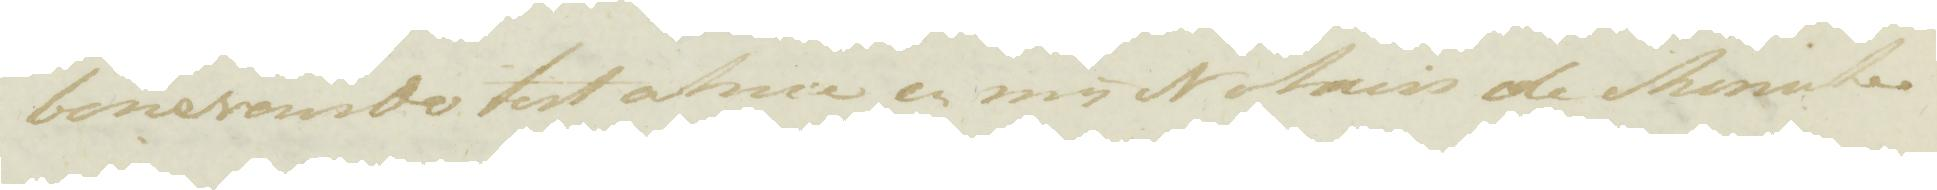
benevens de testatrice en mij Notaris de minute
